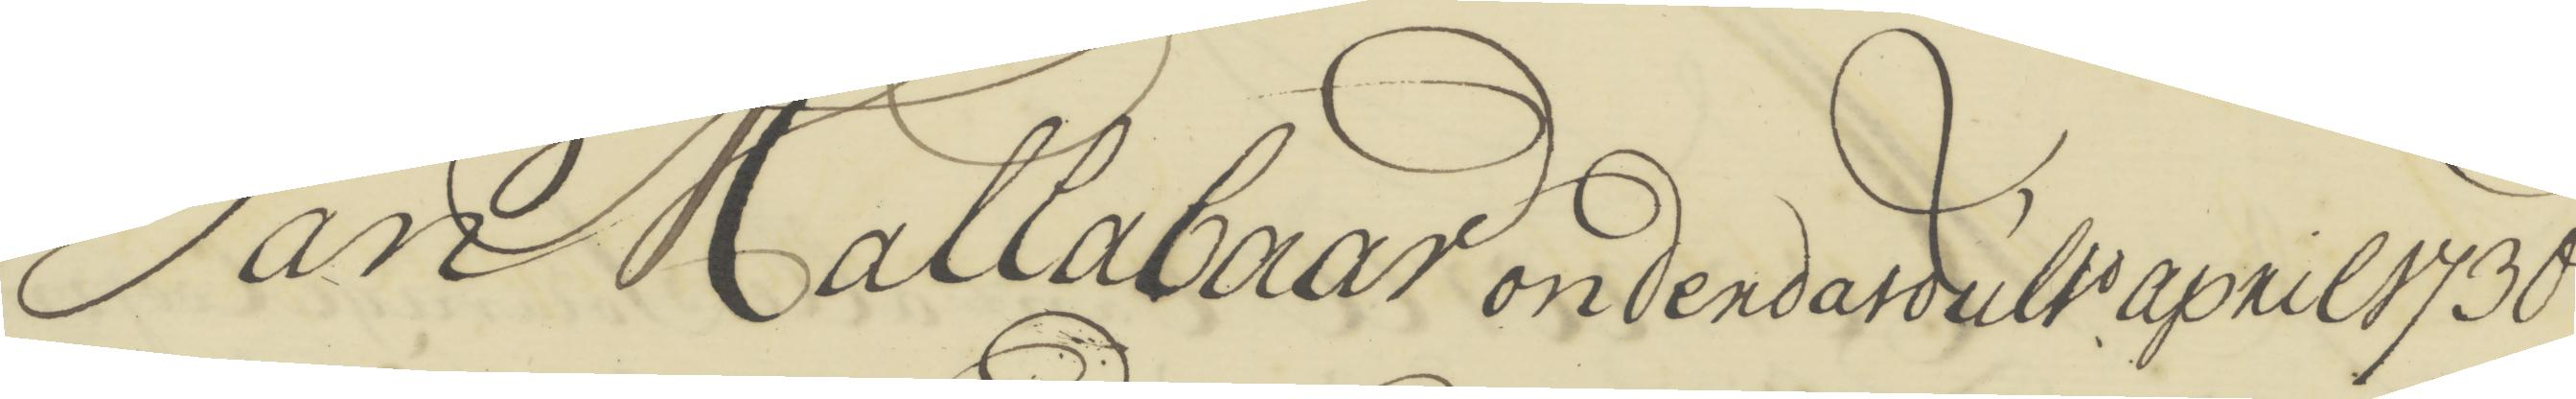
Van Mallabaar onder dato ult.o april 1730
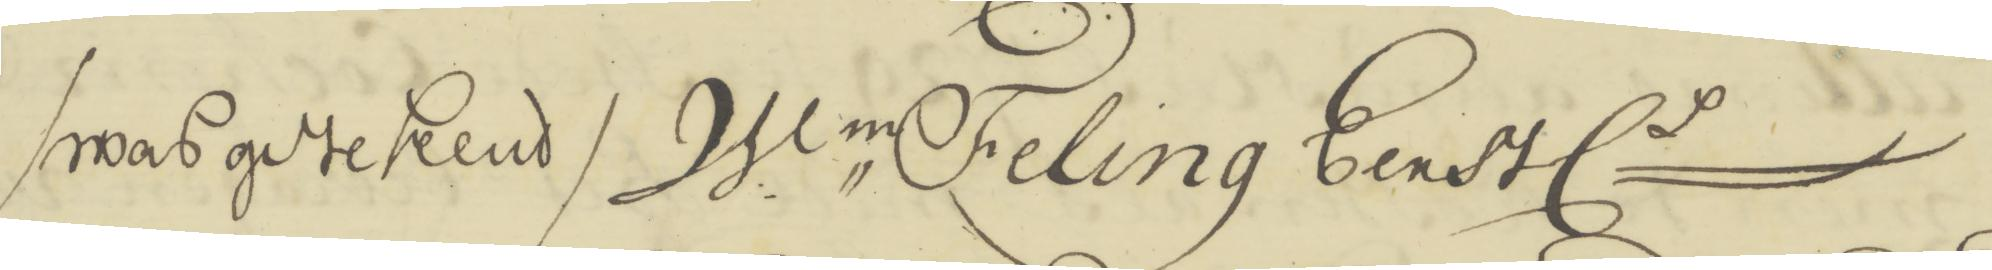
/was getekend/ W„m Feling Eerst C=s
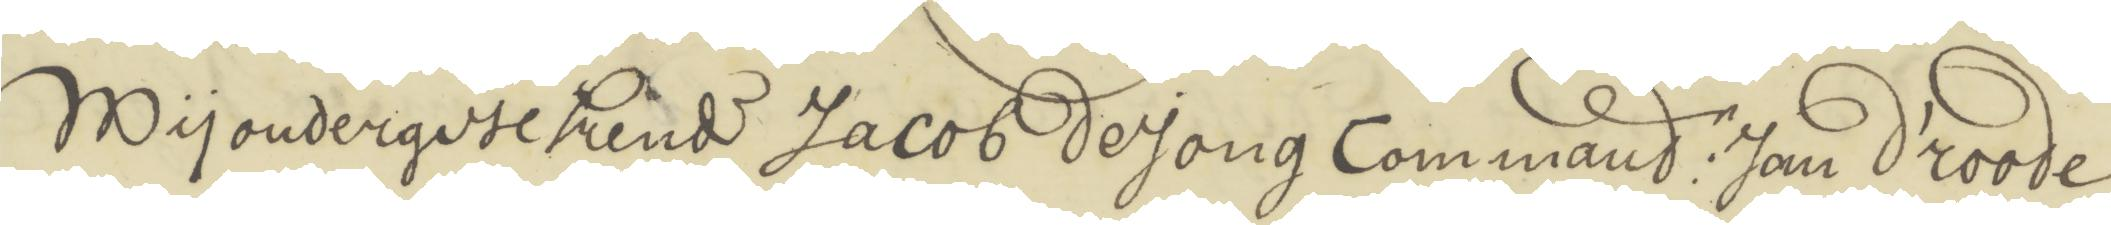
Wij ondergetekende Jacob de Jong Command:r Jan d'roode
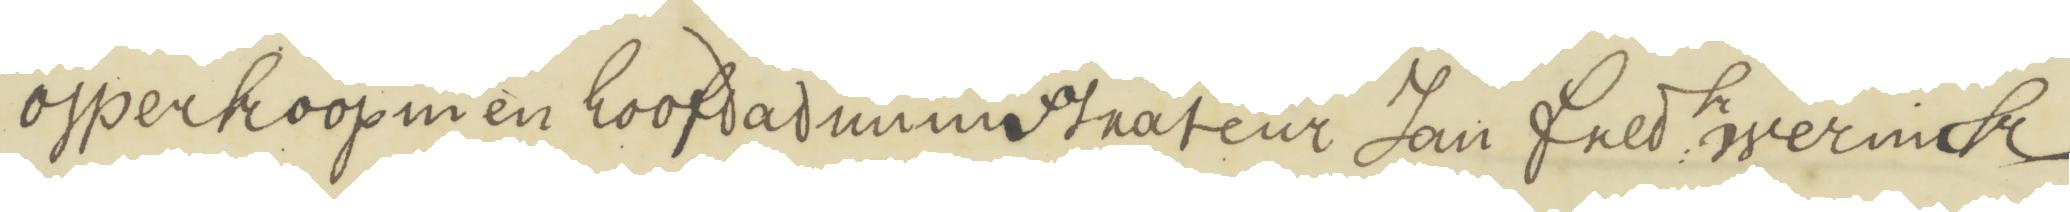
opperkoopm en hoofdadministrateur Jan fred:k wernick
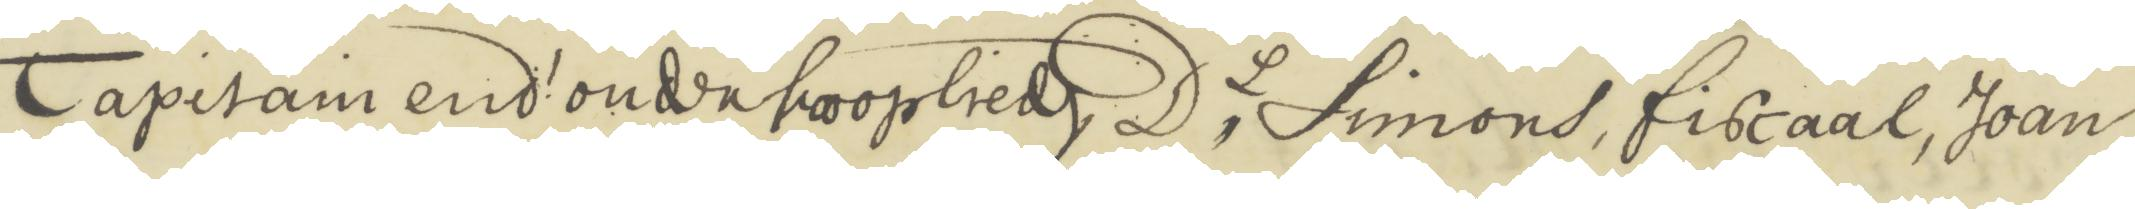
Capitain en d’onder kooplieden D„l Simons, fiscaal, Joan
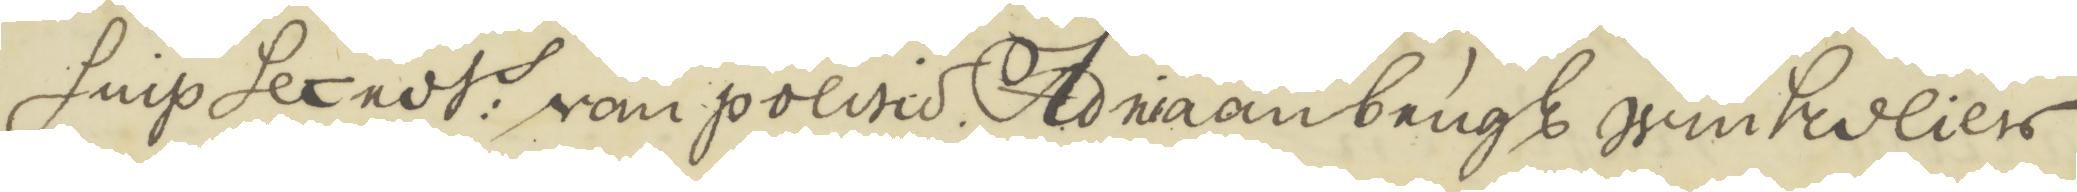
snip secret:s van politie. Aldiaan brugh winkelier
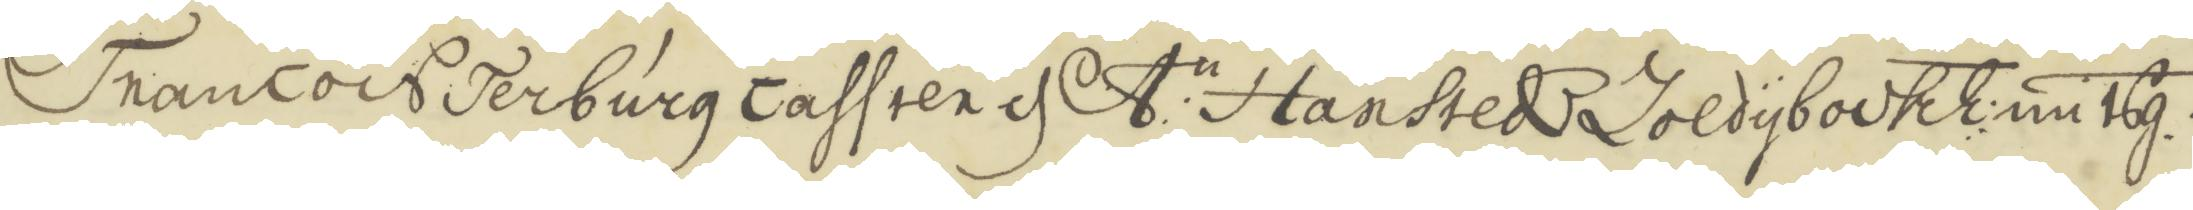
Francois Terburg cassier en A:n Hanstede zoldijboekh: mitsg:
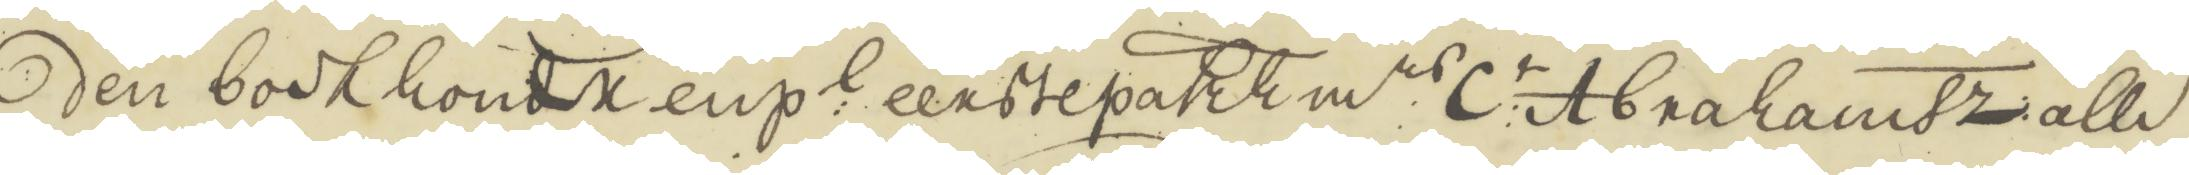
den boekhouder en p:l eerste pakhm:rs C:t Abrahamsz: alle
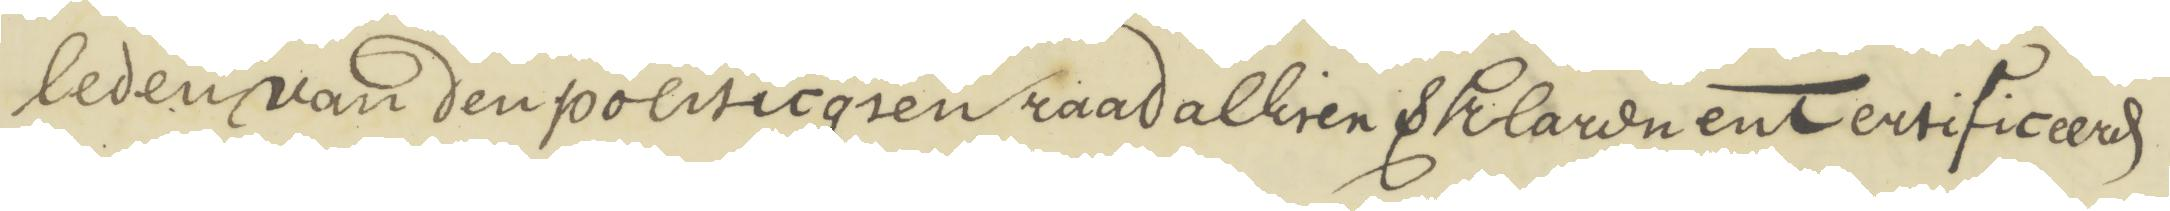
leden van den politicqien raad alhier verklaren en certificeeren
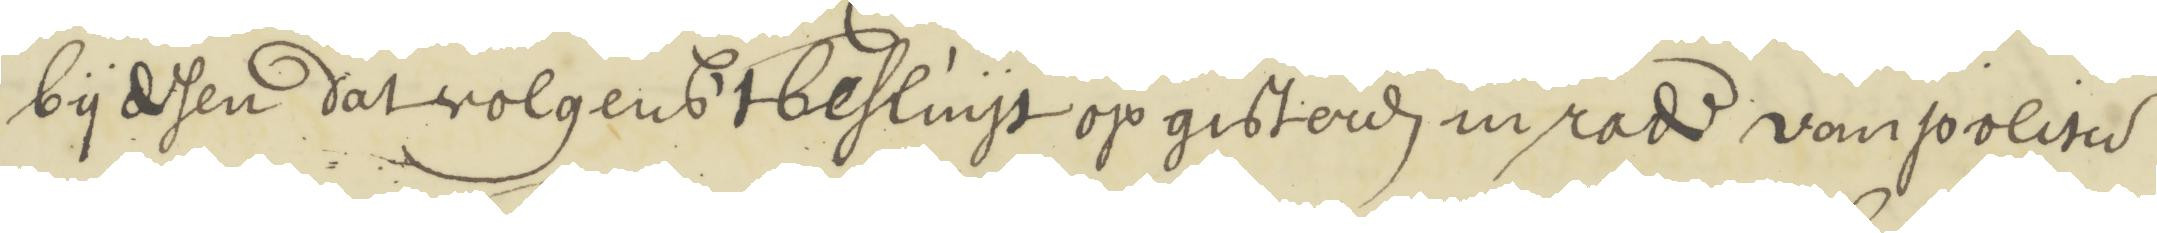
bij desen dat volgens ’t besluijt op gisteren in rade van politie
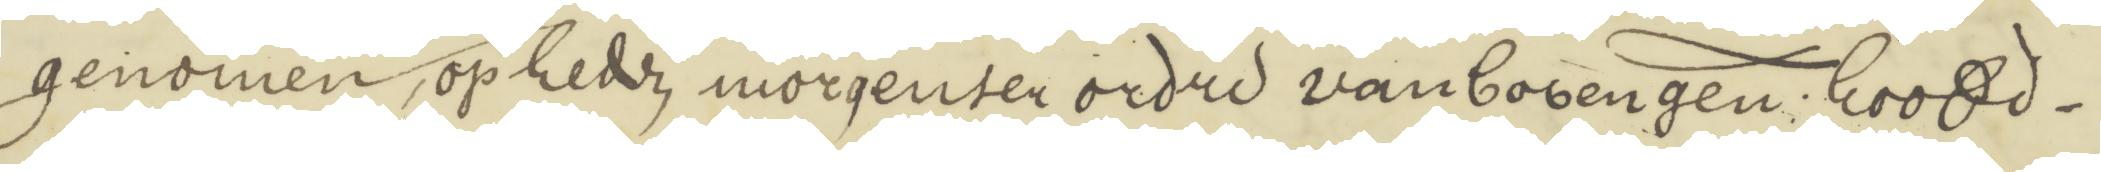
genomen, op heden morgen ter ordre van bovengen: hoofd -
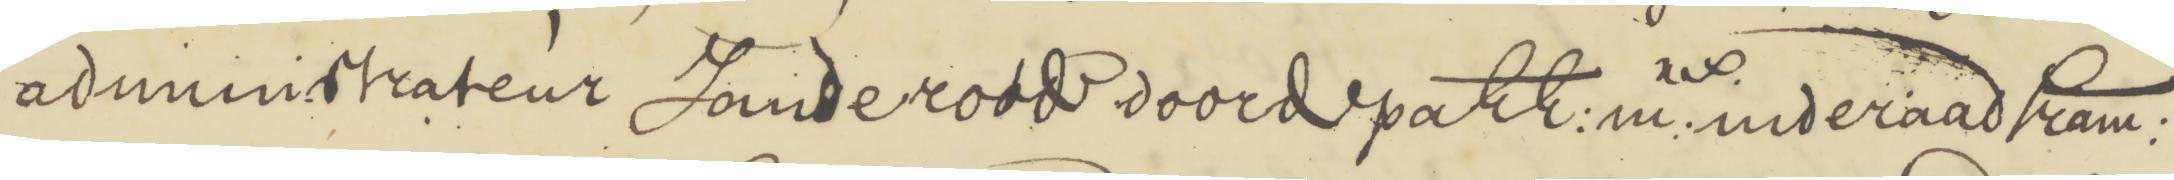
administrateur Jan de roode door de pakh: m:rs inde raad kam:
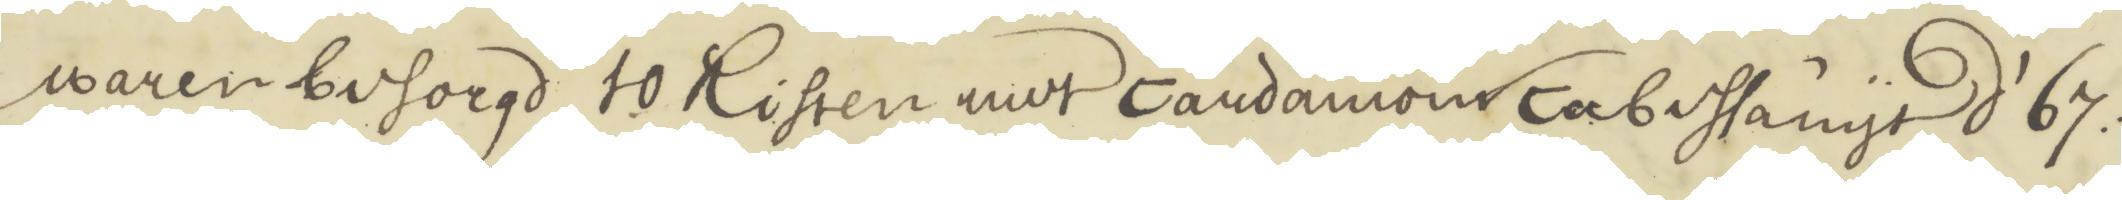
waren besorgd 10 kisten met cardamon cabessauijt d’ 67:
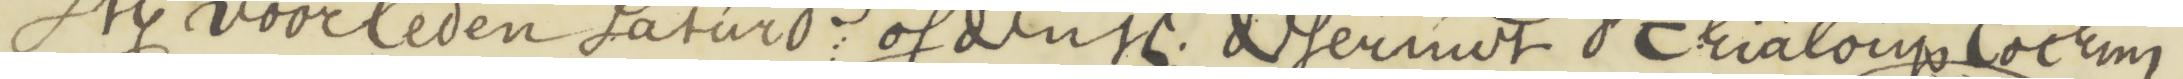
stx voorleden saturd:g of den 15: deser met d’ chialoup Cochim
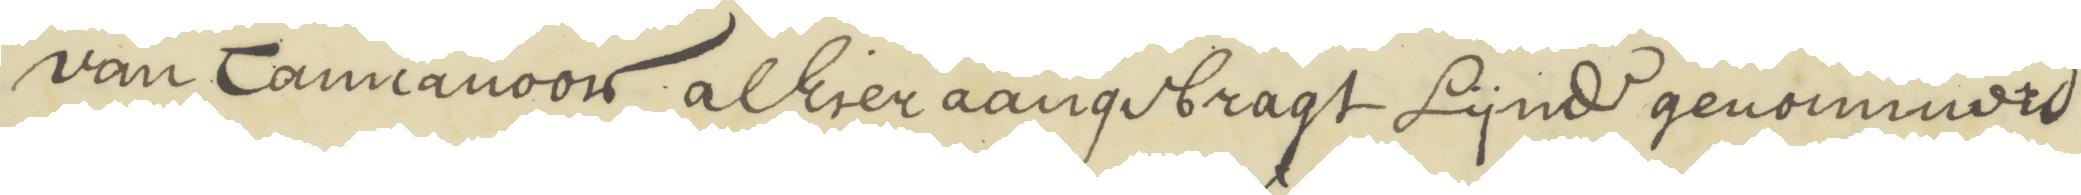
van Cannanoor alhier aangebragt sijnde genommerd
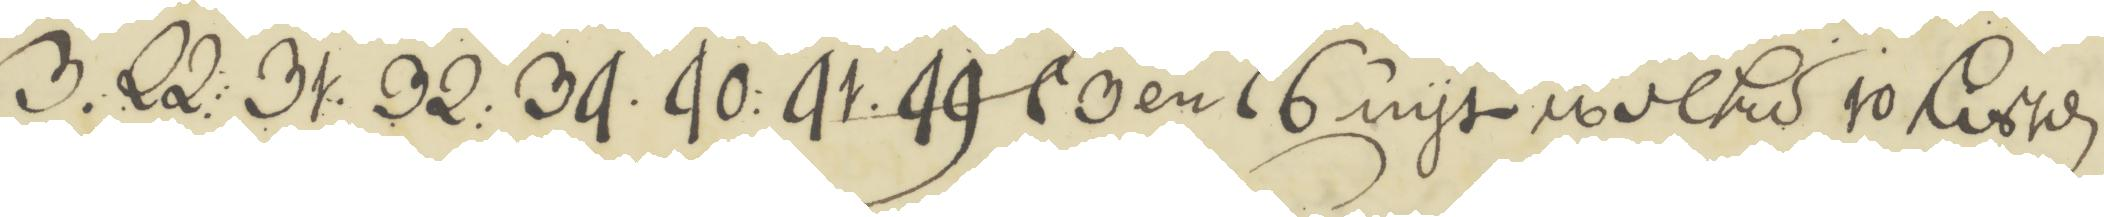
3: 22: 31: 32: 34. 40: 41. 49 53 en 56 uijt welke 10 kisten
